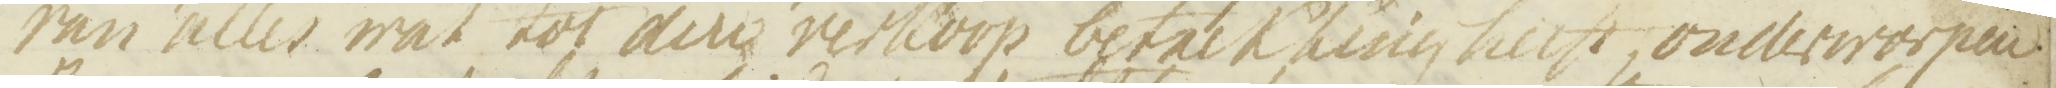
van alles wat tot den verkoop betrekking heeft, onderworpen
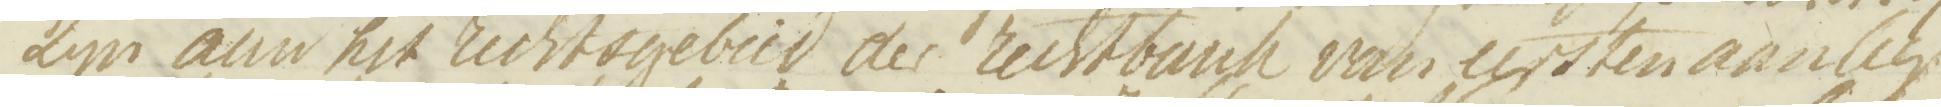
Zyn aan het rechtsgebied der rechtbank van eersten aanleg
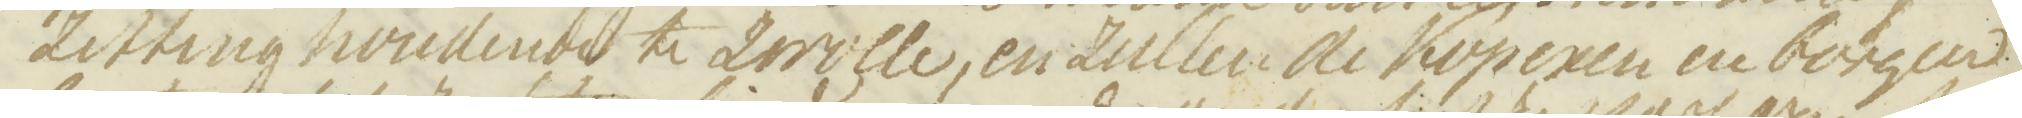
Zitting houdende te Zwolle, en Zullen de Koperen en borgen
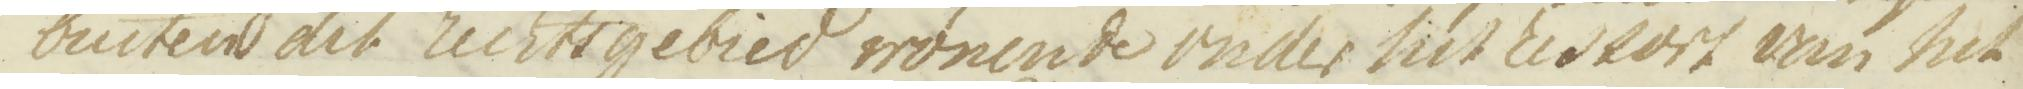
buiten dit rechtsgebied wonende onder het ressort van het
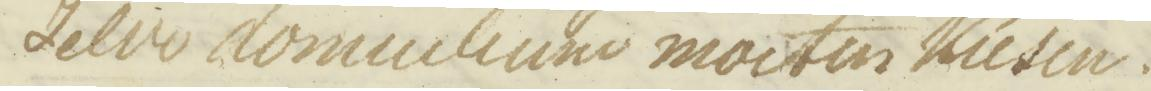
Zelve domcilium moeten Kiesen.
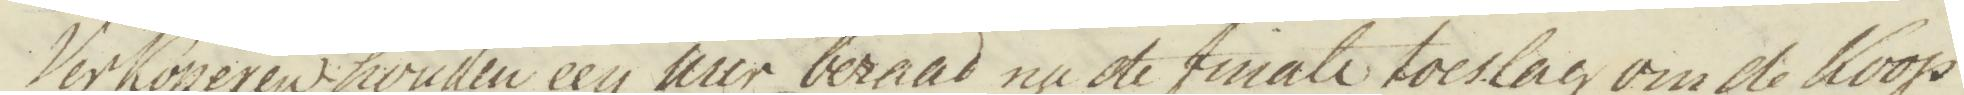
Verkoperen houden een uur beraad na de finale toeslag om de Koop
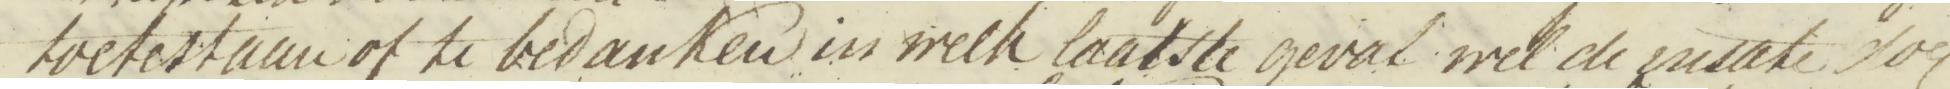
toetestaan of te bedanken, in welk laatste geval wel de insake Vol
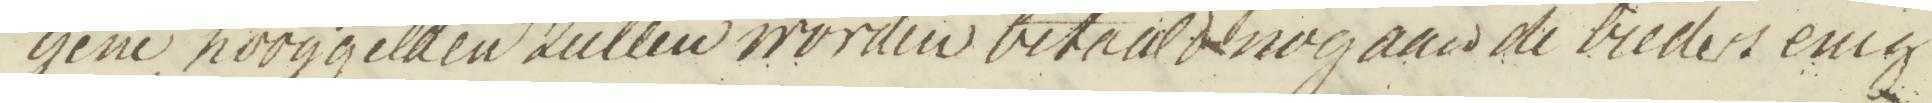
gene hooggelden Zullen worden betaalde nog aan de bieder enig
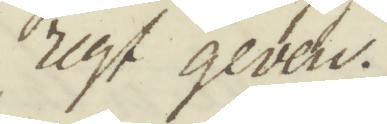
regt geven.
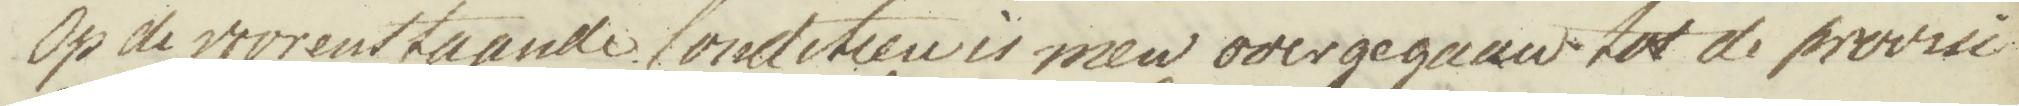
Op de voorenstaande Conditien is men overgegaan tot de provisi
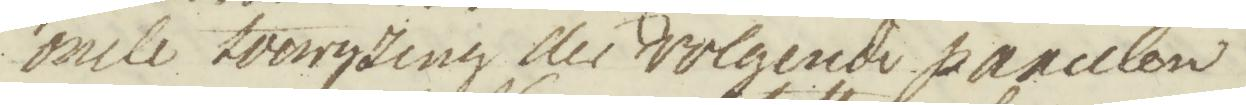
onele toewyzing der volgende parcelen
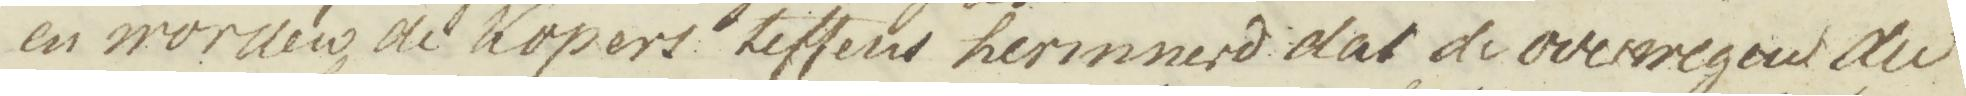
en worden, de Kopers teffens herinnerd dat de overwegen die
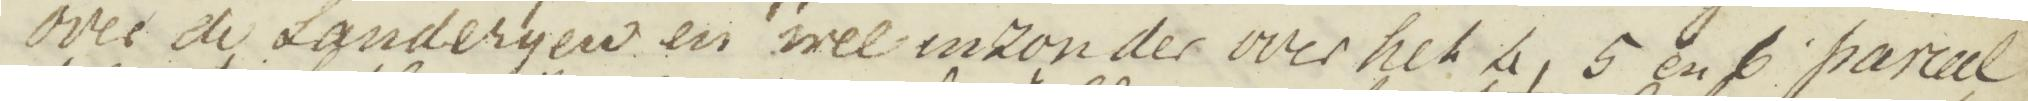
over de Landeryen en wel inzonder over het 4, 5 en 6' parceel
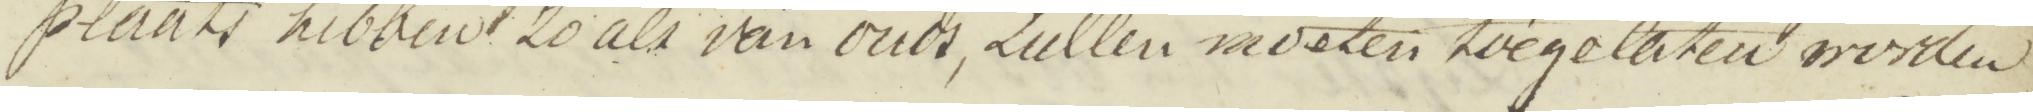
plaats hebben Zo als van ouds, Zullen moeten toegelaten worden
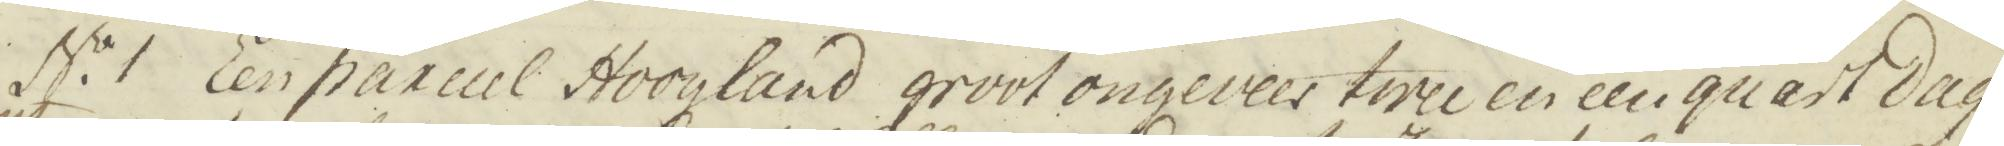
N.o 1 Een parceel Hoogland groot ongeveer twee en een quart dag
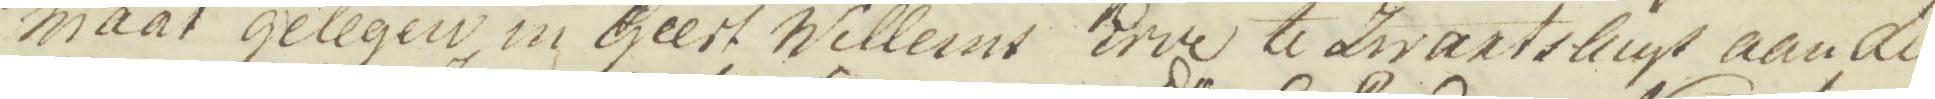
maat gelegen in Geert Willems Erve te Zwartsluys aan de
